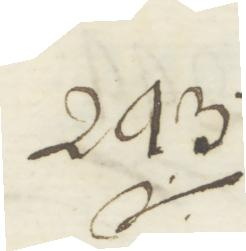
243:
